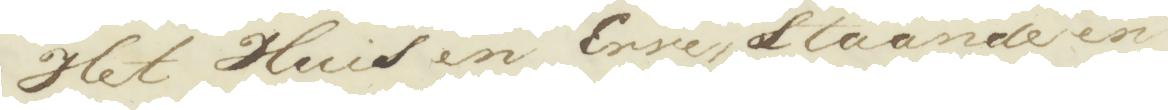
Het Huis en Erve, staande en
